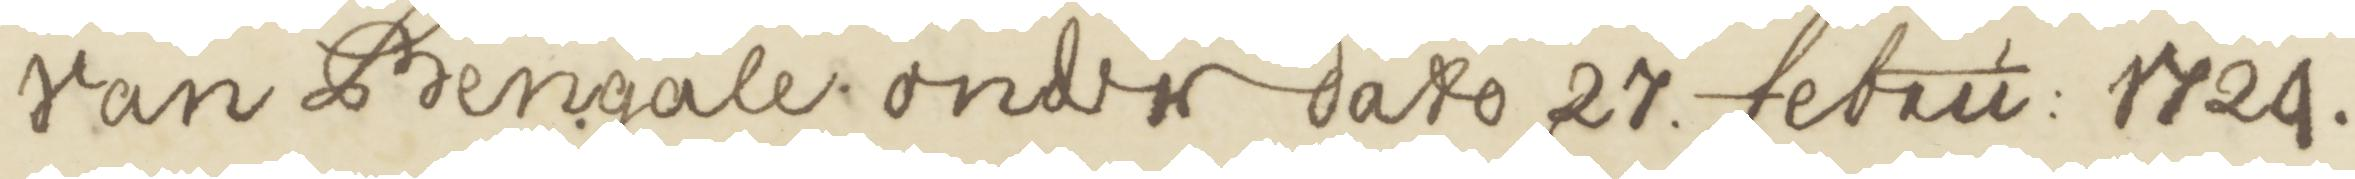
van Bengale onder dato 27. febru: 1724.
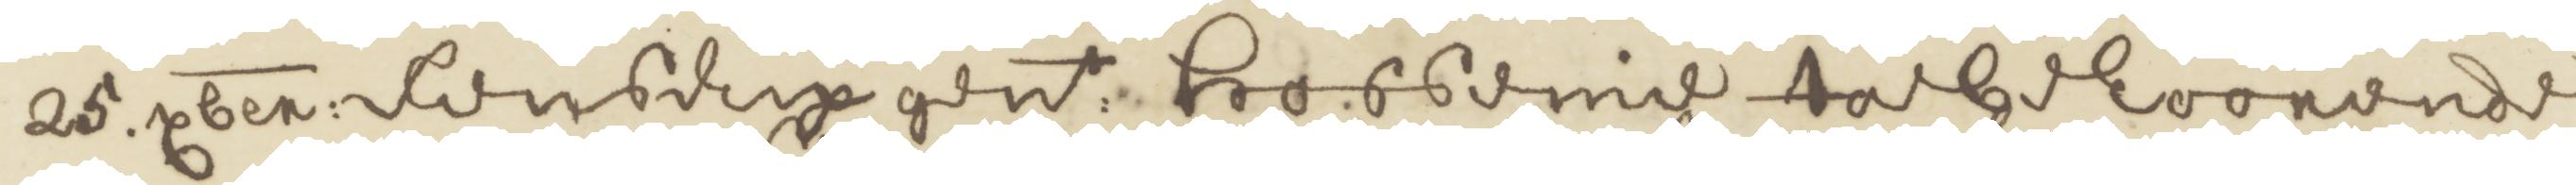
25. xber: Een schip gen:t hossenie toebehoorende
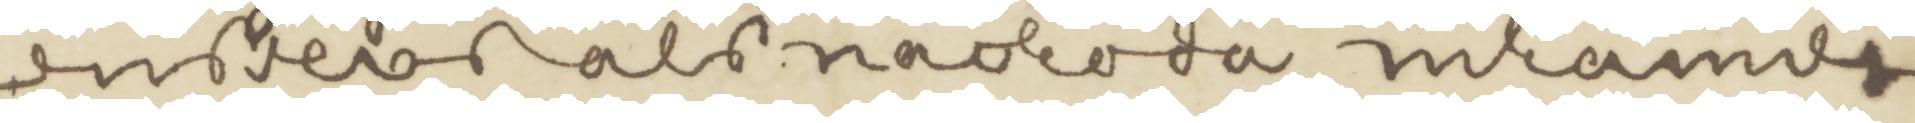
dnselvs als nachoda Mhamet
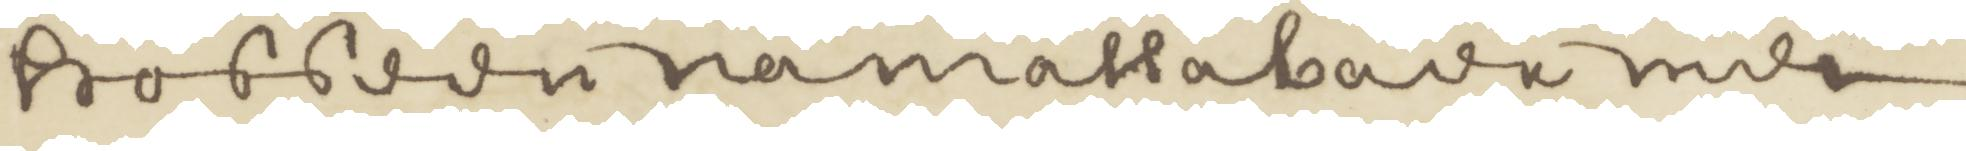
Hosseen namattabaer met
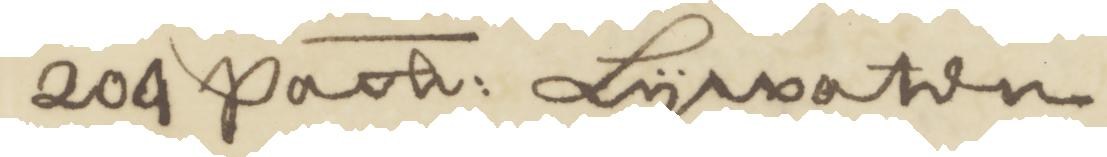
204 pack: Lijwaten
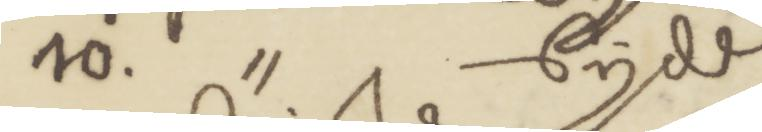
10. „ sijde
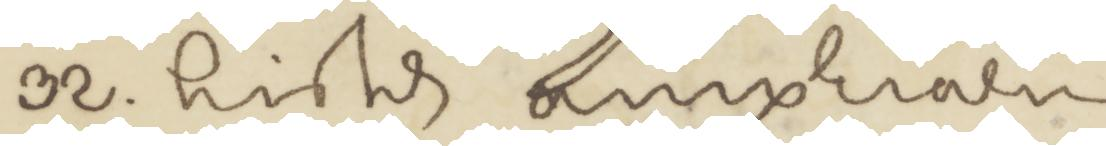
32. kisten amphioen
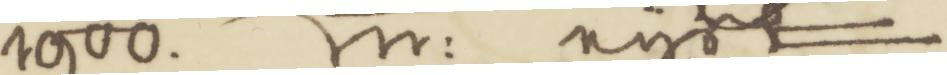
1900. m: rijst
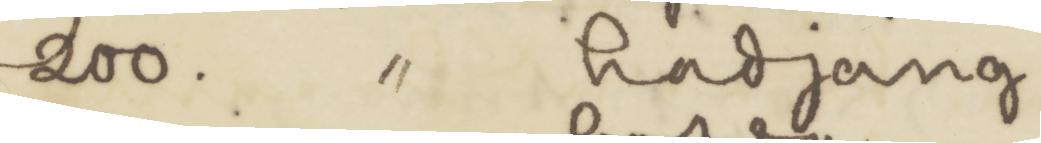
200. „ kadjang
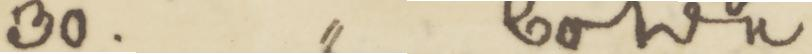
30. „ boter
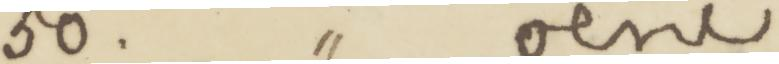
50. „ olie
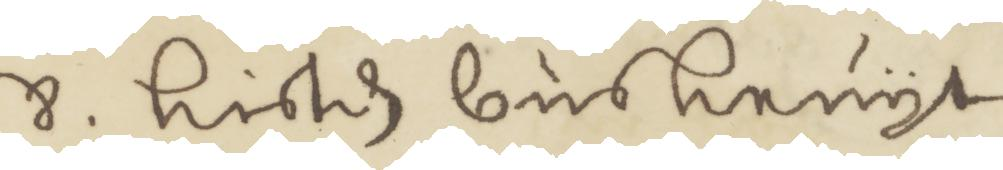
8. kisten buskruijt
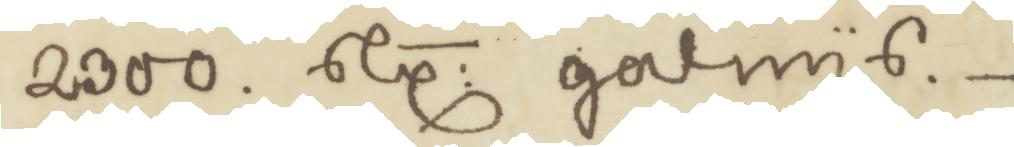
2300. stx: goenijs. —
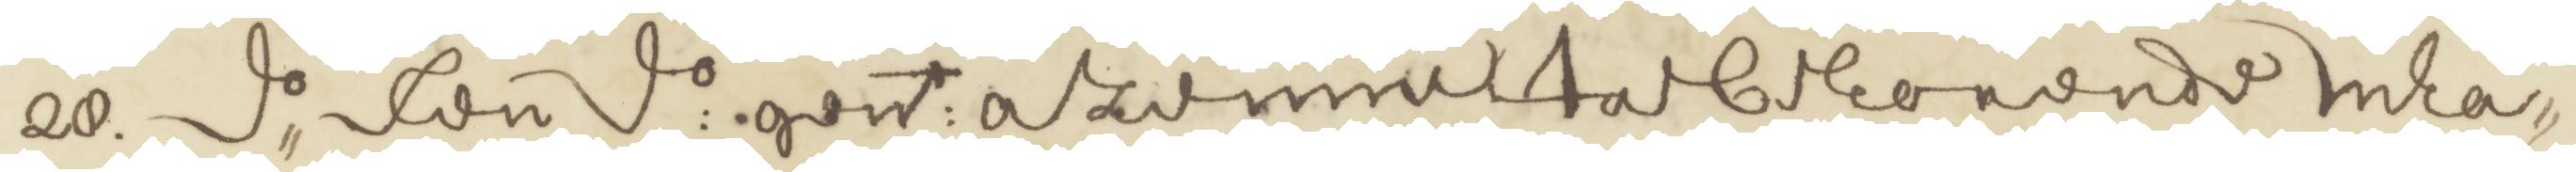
28. D„o Een D:o gen:t a zenne toebehorende Mha„
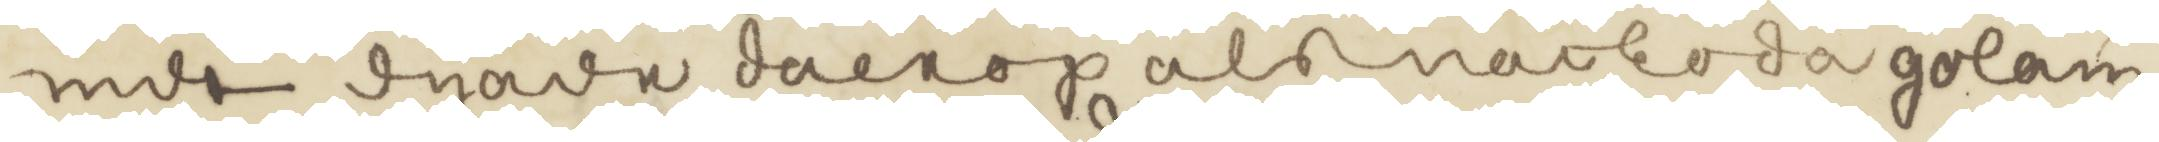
met eijaer daerop als nachoda golam
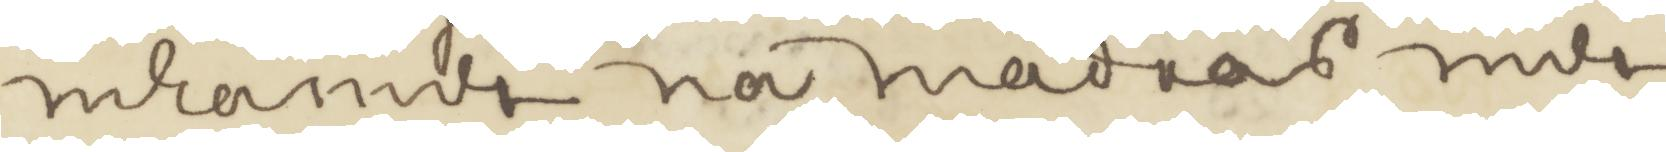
mhamet na Madras met
